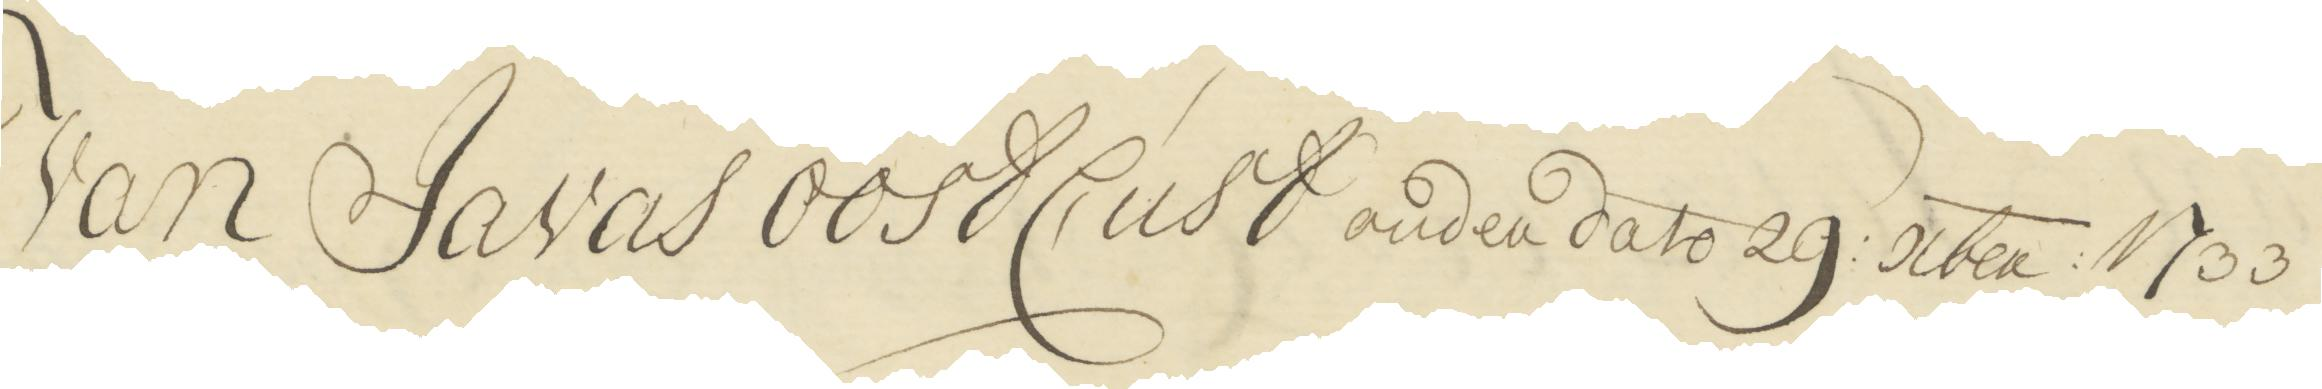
Van Javas oost Cust onder dato 29:' xber: 1733
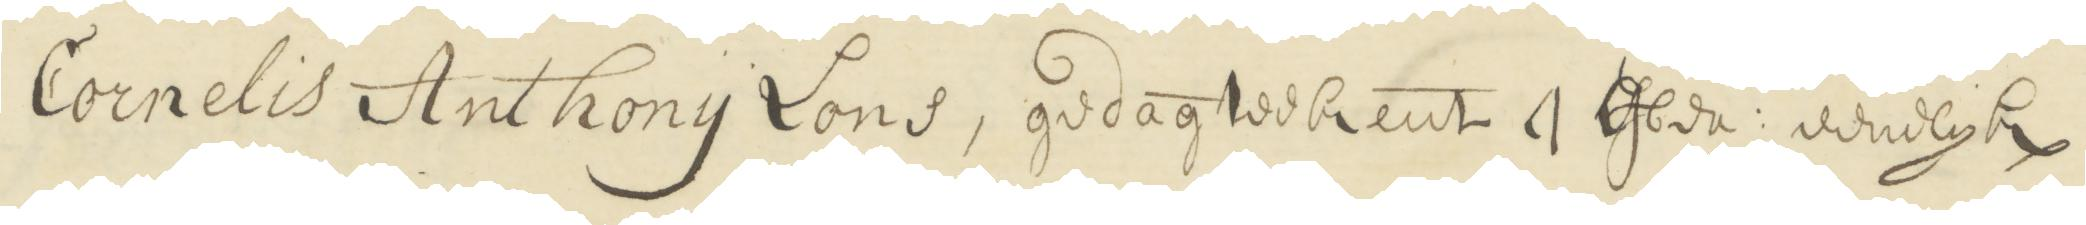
Cornelis Anthonij Lons, gedagteekent 4 9ber: eenelijk
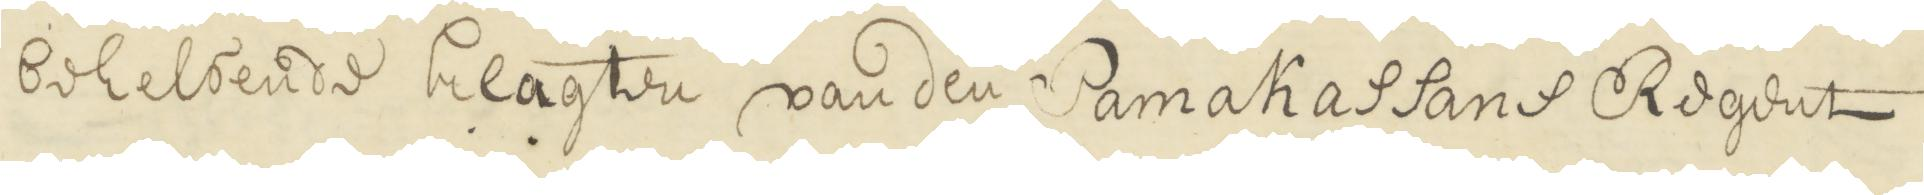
behelsende klagten van den Pamakassans Regent
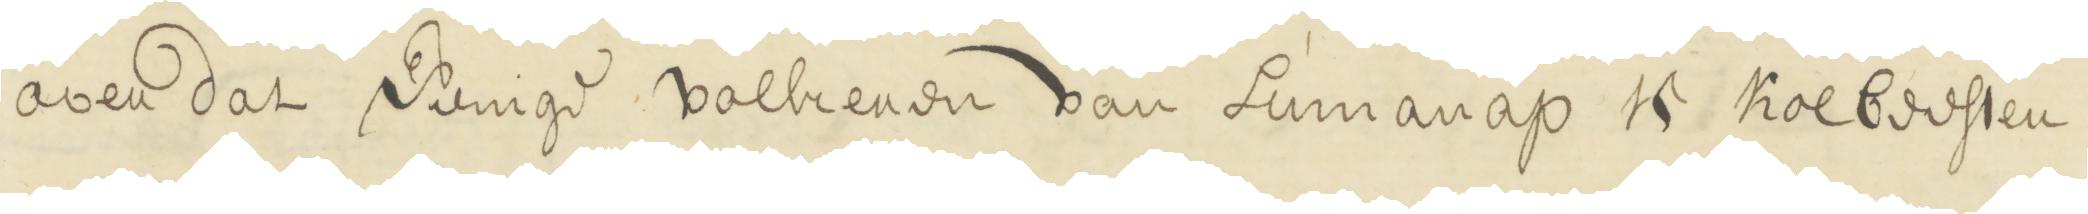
over dat eenige volkeren van sumanap 15 koebeesten
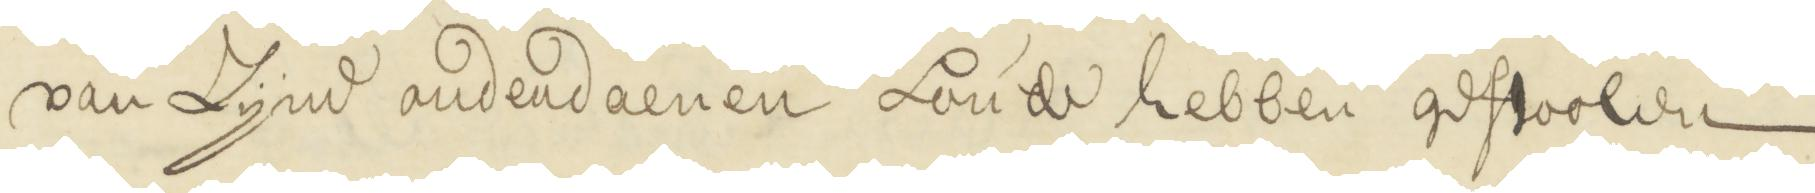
van zijne onderdaenen soude hebben gestoolen
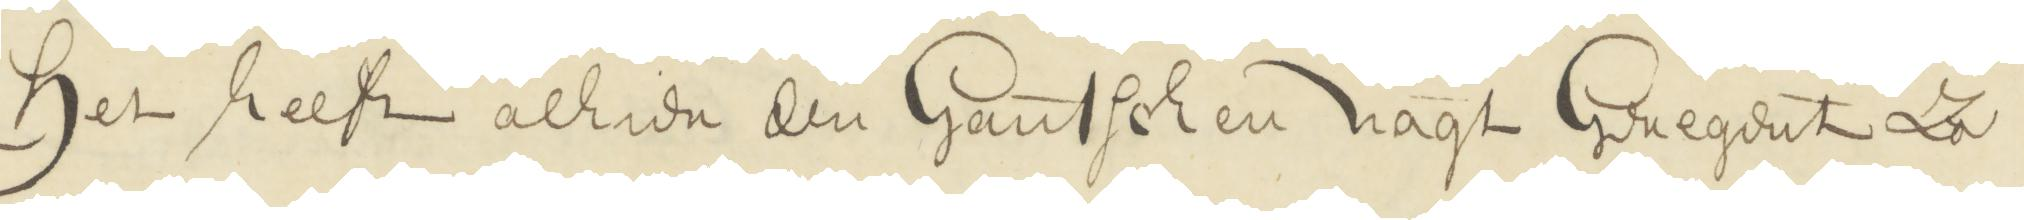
Het heeft alhier den Gantschen nagt Geregent zo
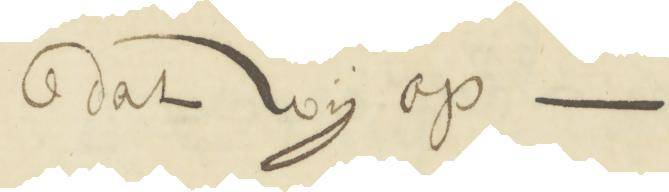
dat wij op —
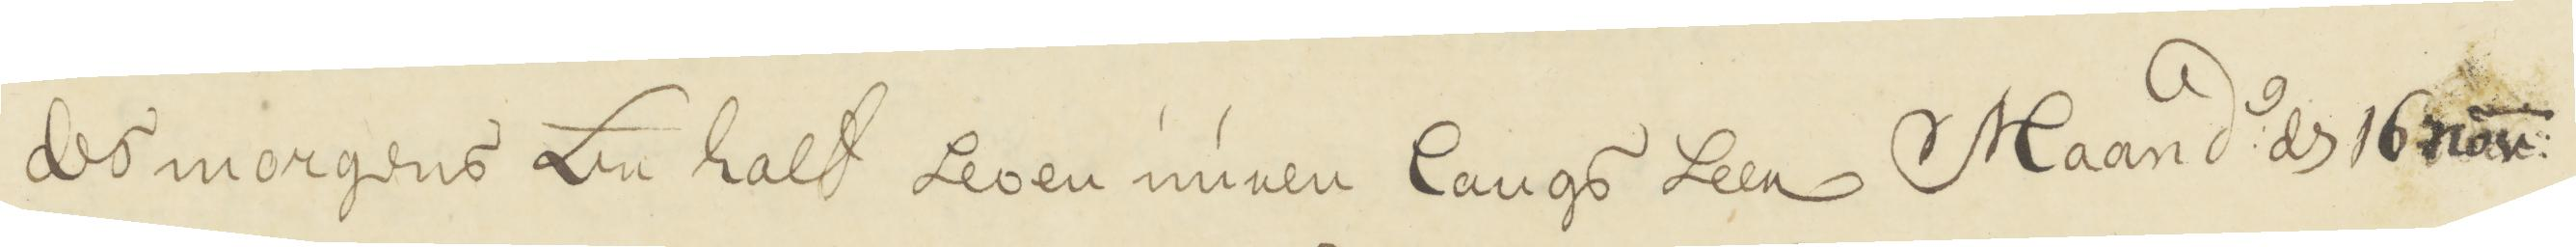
des morgens ten half seven uuren langs seer Maand:g den 16 nov:
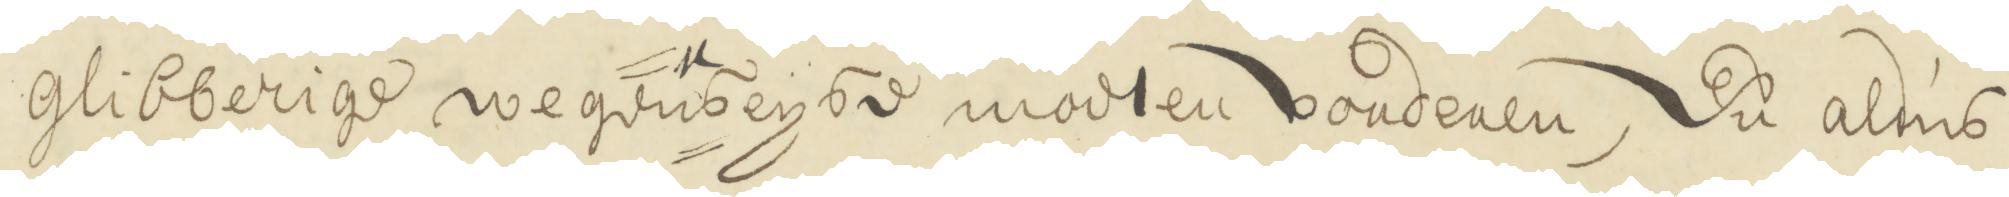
glibberige wegen=tseijse moeten vorderen, en aldus
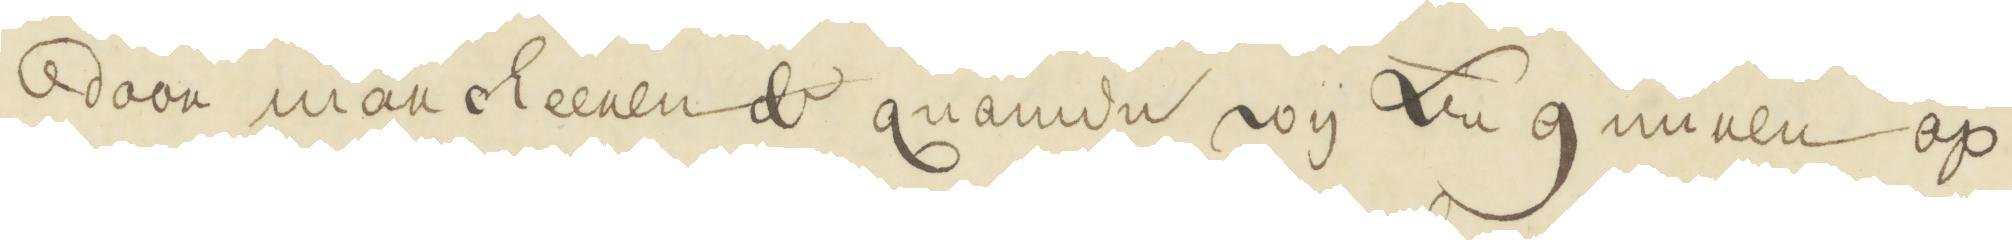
door marcheerende quamen wij ten 9 uuren op
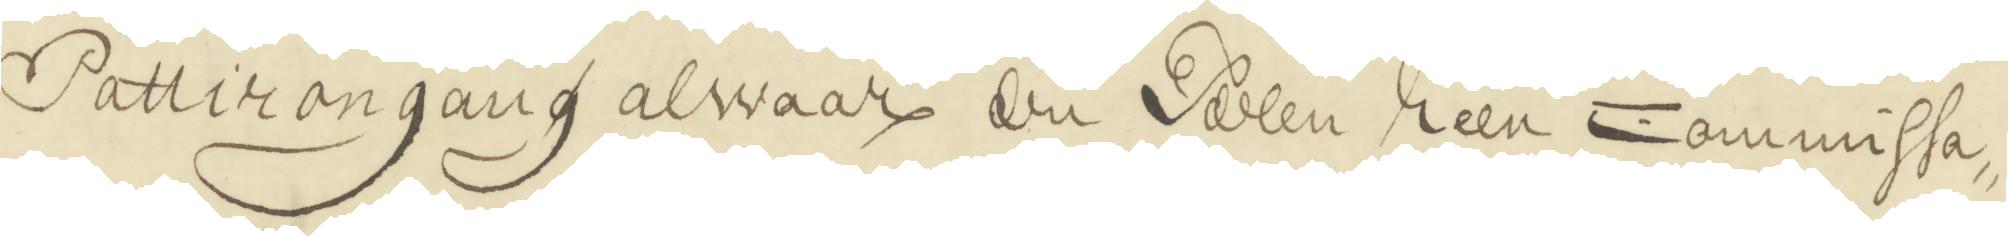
Pattirongang alwaar den Edelen heer commissa„
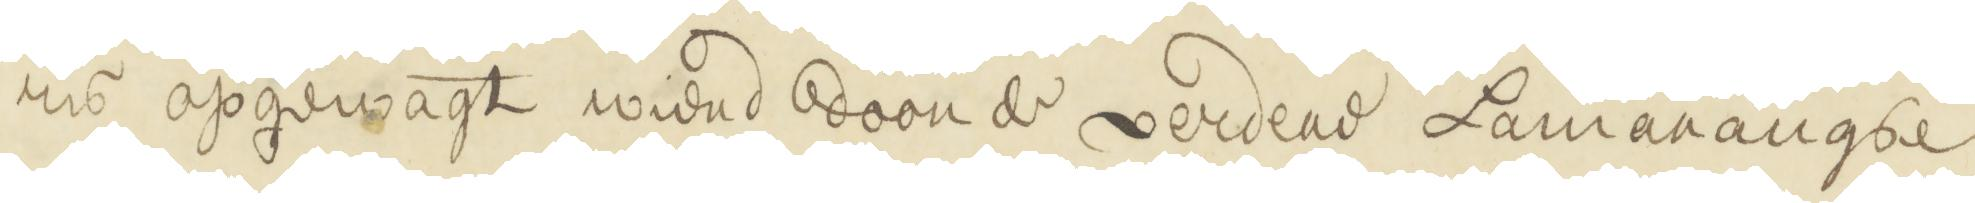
ris opgewagt wierd door de verdere samarangse
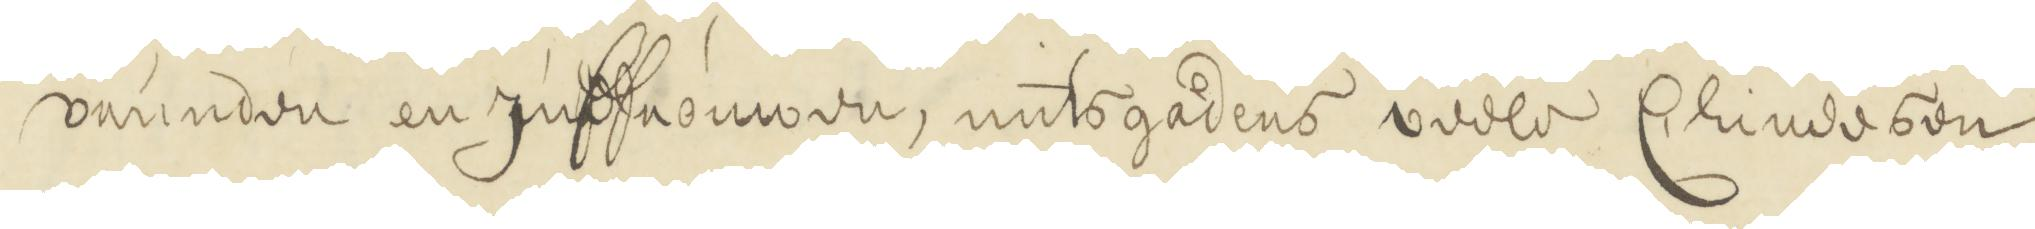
vrunden en Juffrouwen, mitsgaders veele Chineesen
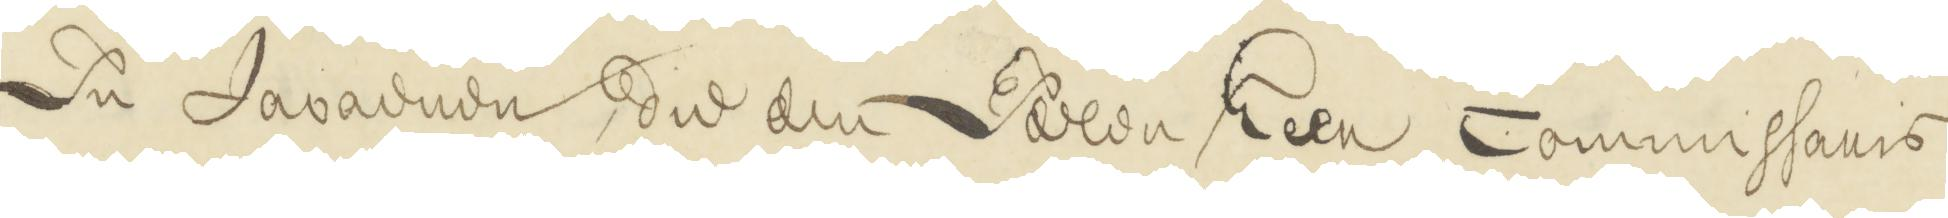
en Javaenen, die den edelen heer commissaris
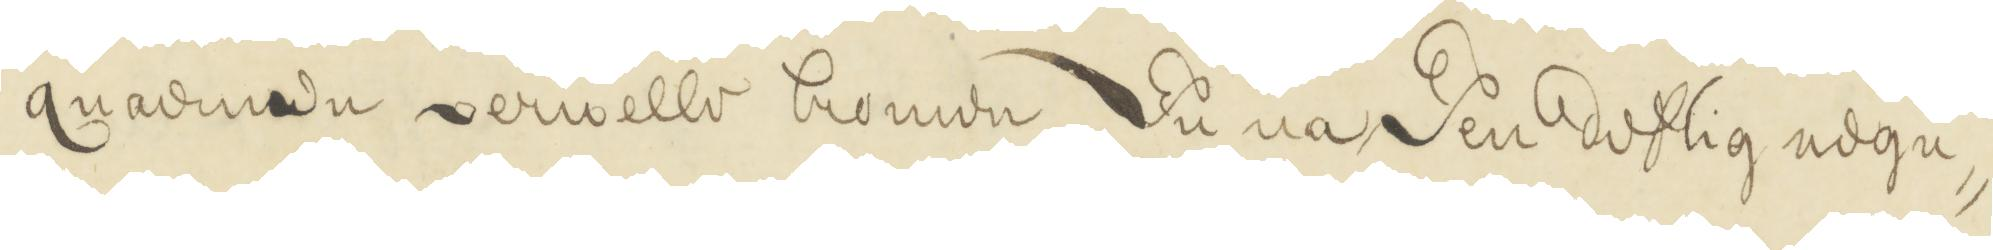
quaemen verwelle komen en na een deftig regu„
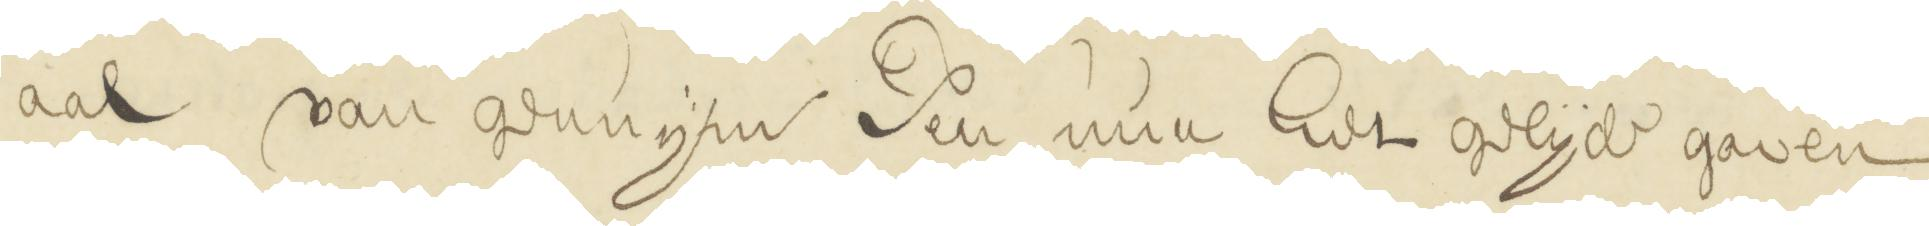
aal van geruijm een uur het gelijde gaven
